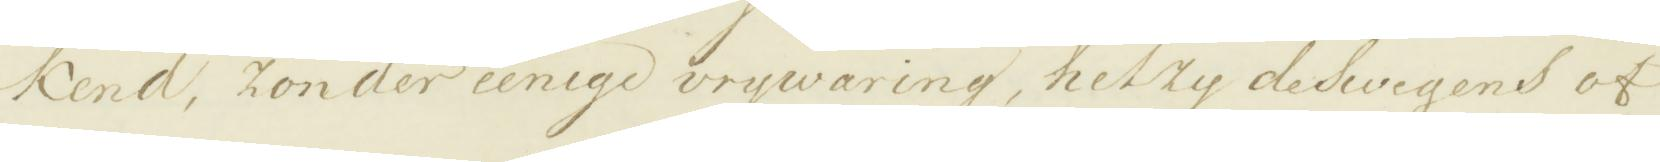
kend, zonder eenige vrywaring, hetzy deswegens of
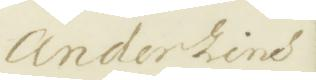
Anderzins
